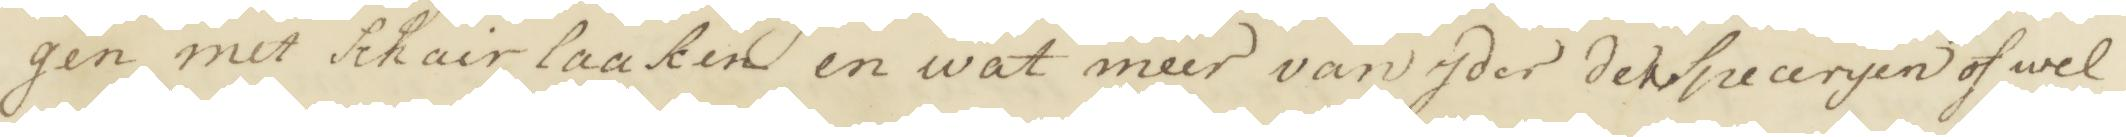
gen met Schair laaken en wat meer van Jder der speceryen of wel
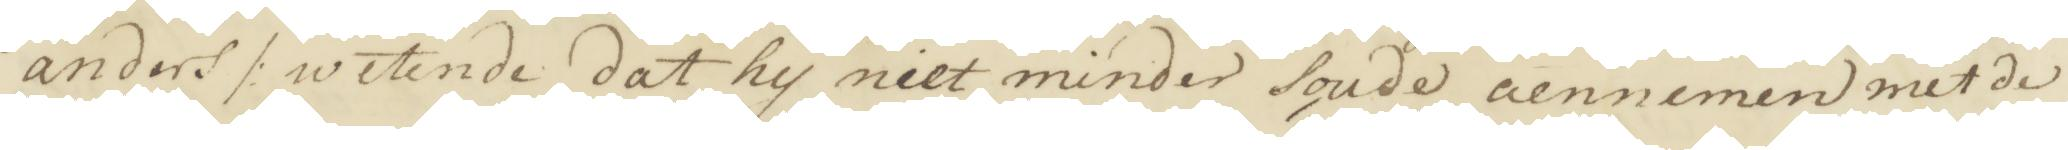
anders /:wetende dat hy niet minder soude aennemen met de
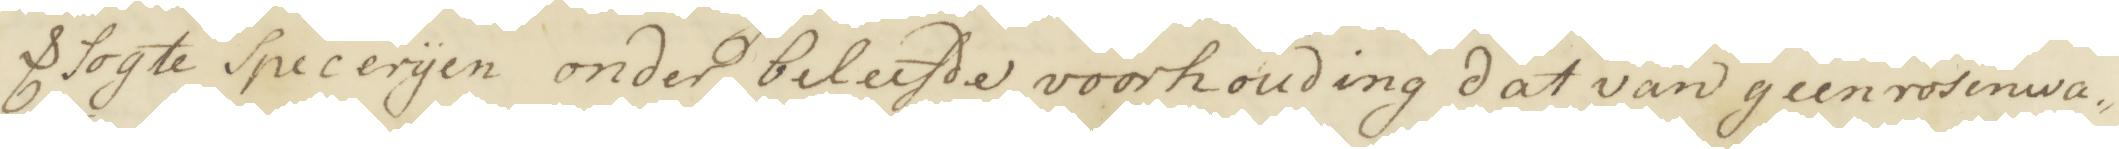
versogte specerijen onder beleefde voorhouding dat van geen rosenwa.
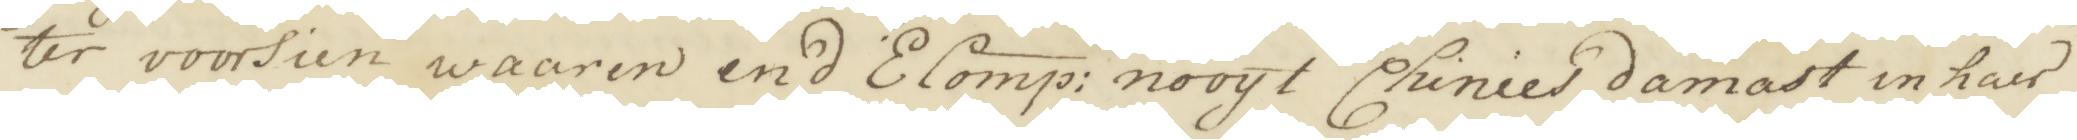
ter voorsien waaren en d E Comp: nooyt Chinees damast in haer
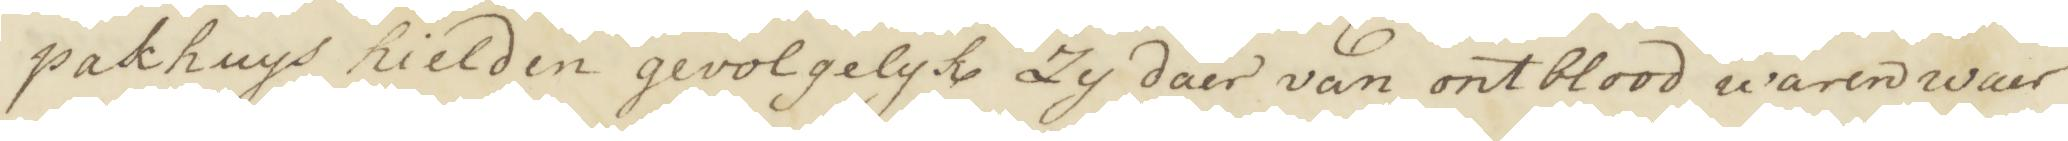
pakhuys hielden gevolgelyk zy daer van ont blood waren waer
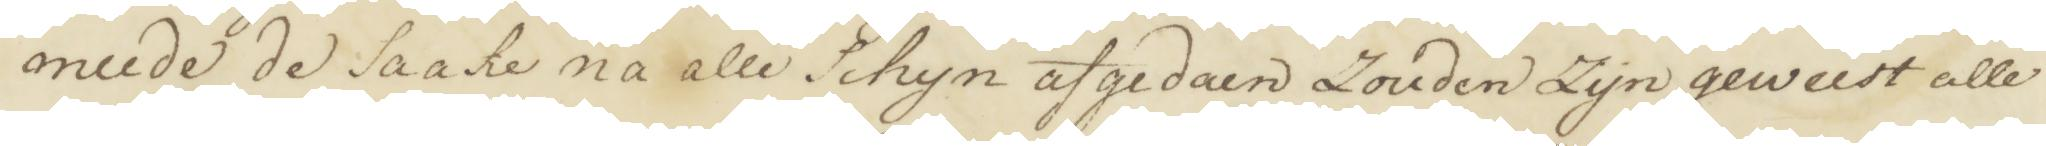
meede de saake na alle schyn afgedaen zouden zijn geweest alle
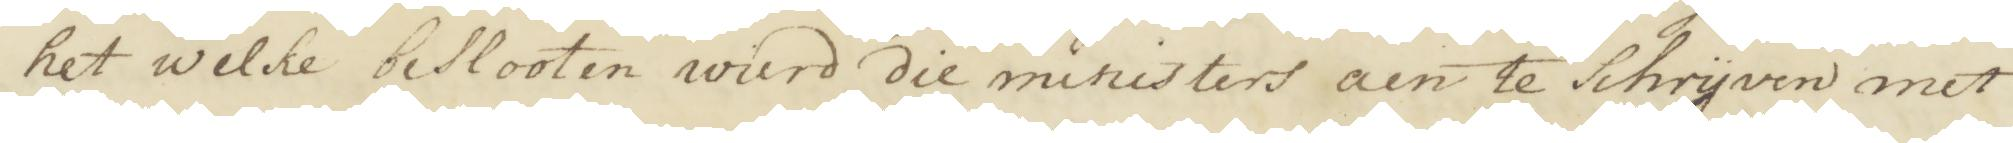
het welke beslooten wierd die ministers aen te schrijven met
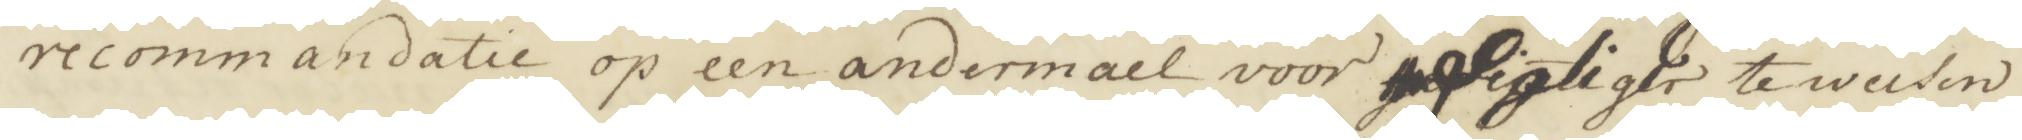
recommandatie op een andermael voor gesigtigEr te weesen
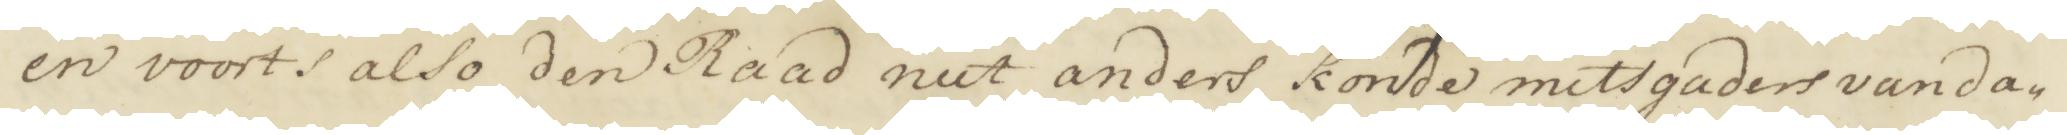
en voorts also den Raad niet anders konde mitsgaders van da„
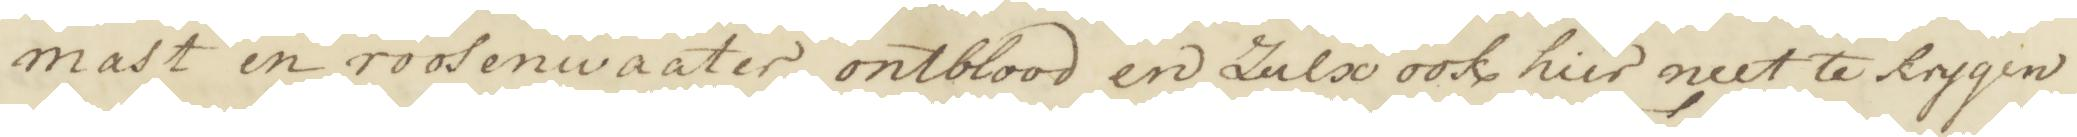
mast en roosenwaater ontblood en zulx ook hier niet te krygen
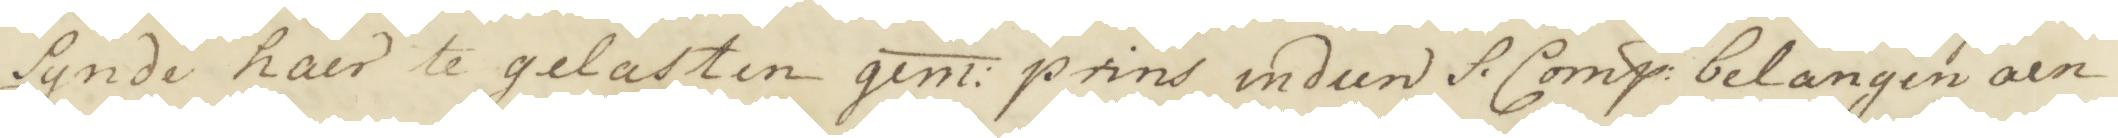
synde haer te gelasten gem: prins in dien s. Comp:s belangen aen
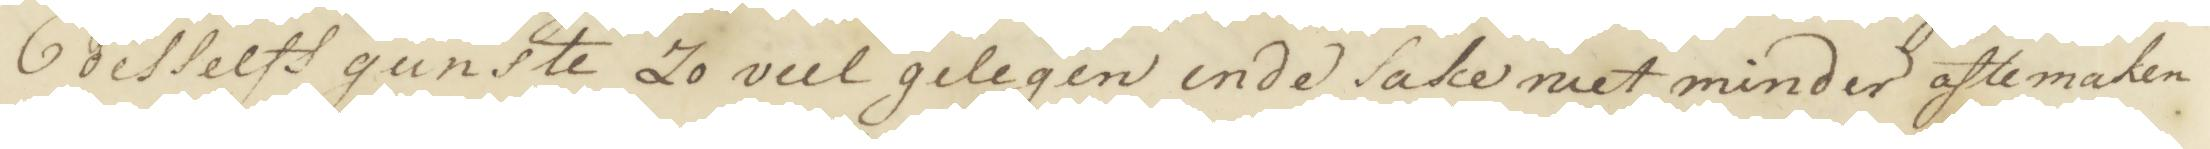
desselfs gunste zo veel gelegen inde sake niet minder aftemaken
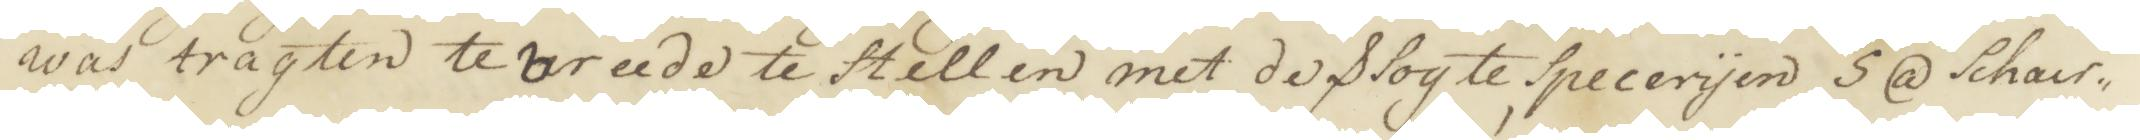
was tragten te vreede te stellen met de versogte specerijen 5 @ schair„
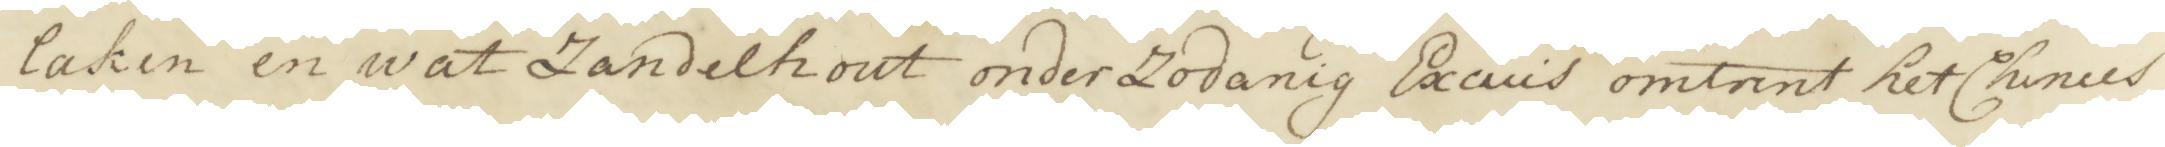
laken en wat zandelhout onder zodanig Excuis omtrent het Chinees
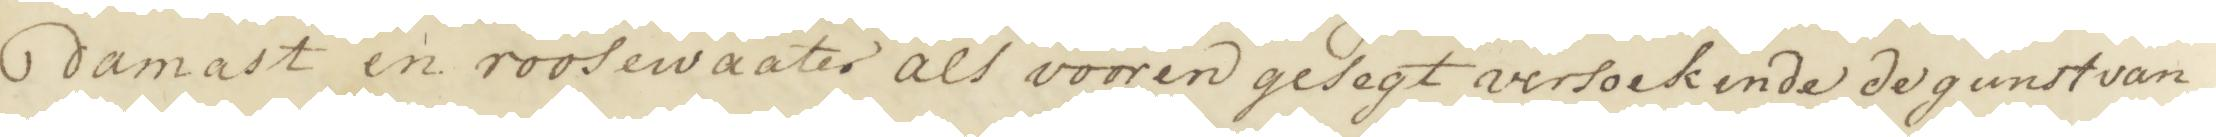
damast en roosewaater als vooren gesegt versoekende de gunst van
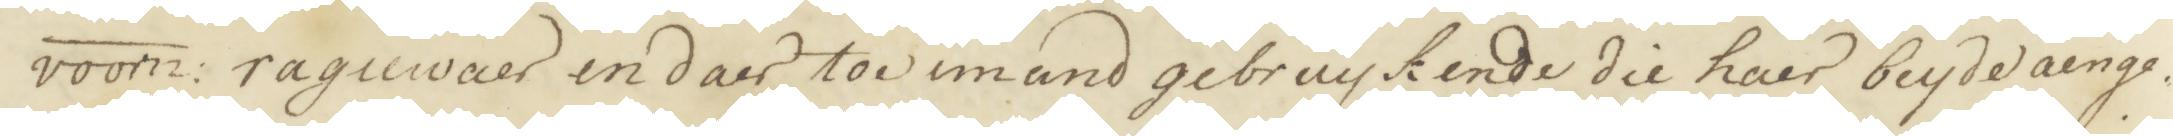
voorn: ragiewaer en daer toe imand gebruykende die haer beyde aenge
